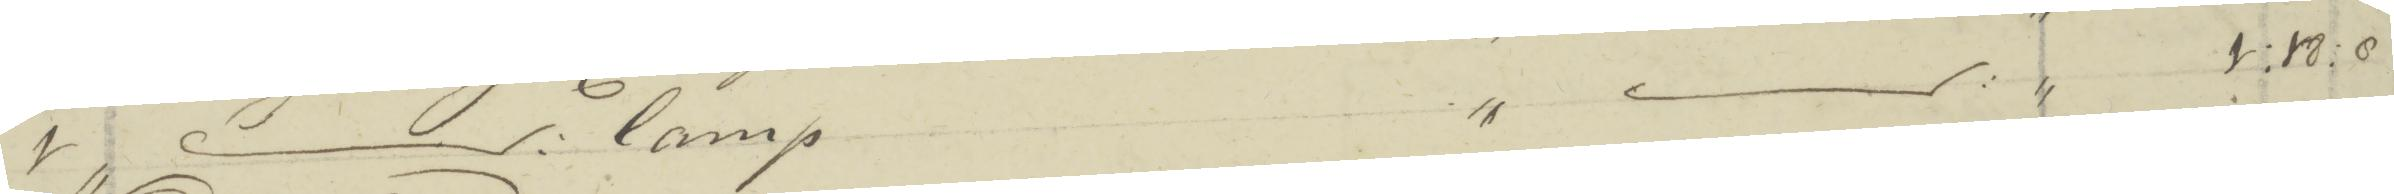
1„ —: lamp „ —: „ 1:18:8
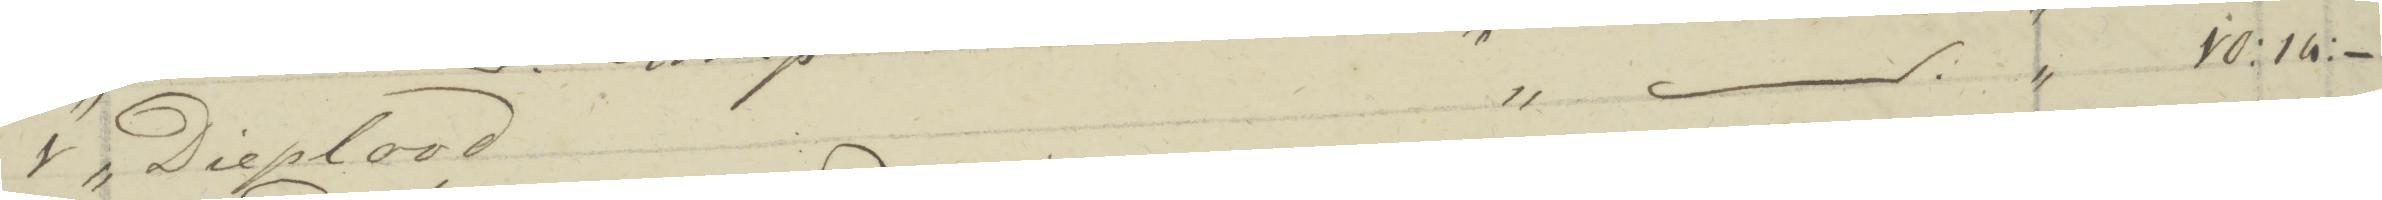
1„ Dieplood „ —: „ 10:14:—
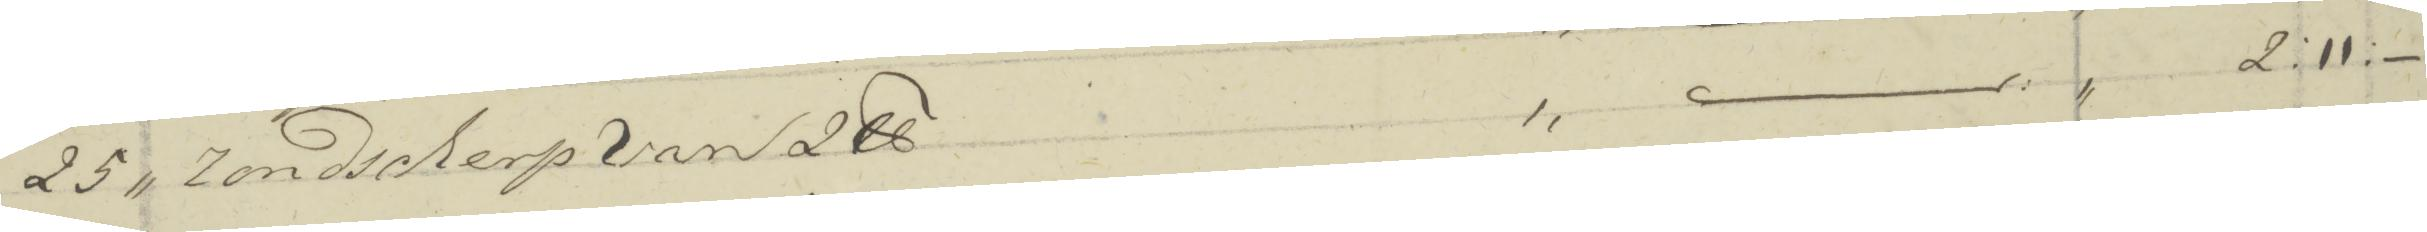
25 „ rondscherp van 2 lb „ —: „ 2:11:—
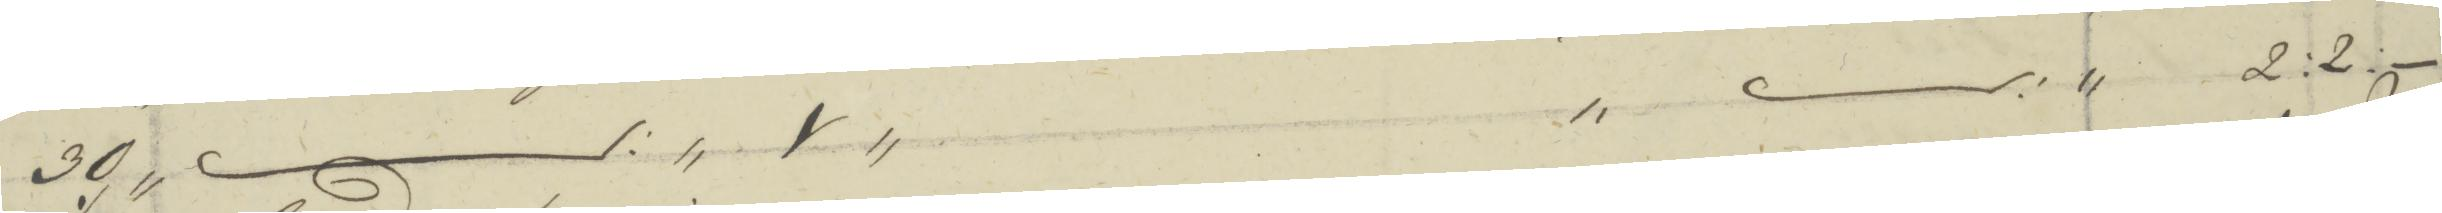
30„ —: „ 1 „ „ —: „ 2:2:—
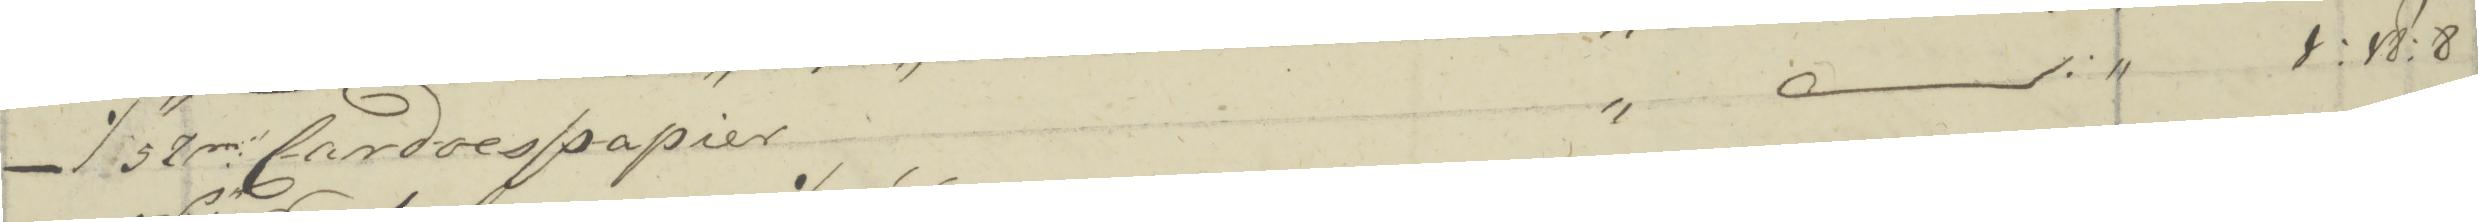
— 1/5 r:m Cardoespapier „ —: „ 1:18:8
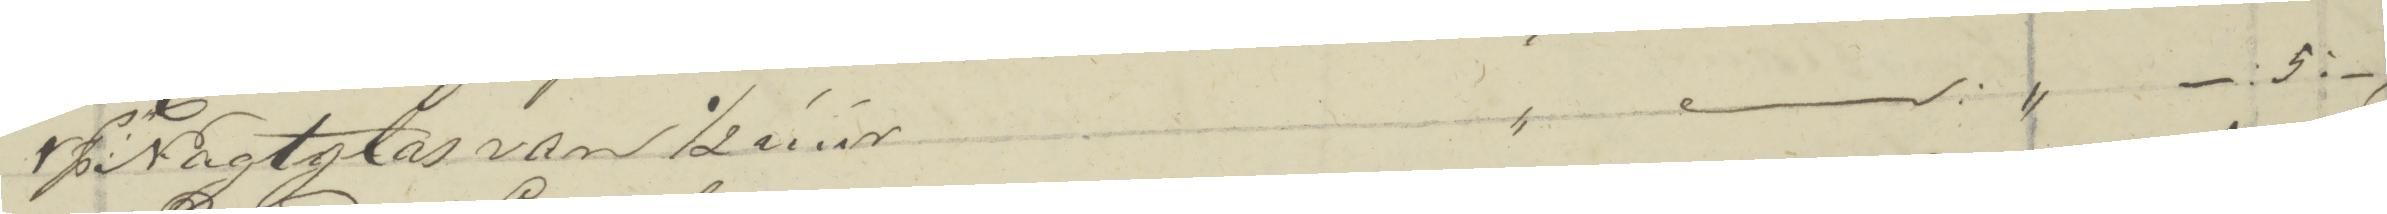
1p:s Nagtglas van ½ uur „ —: „ —: 5:—
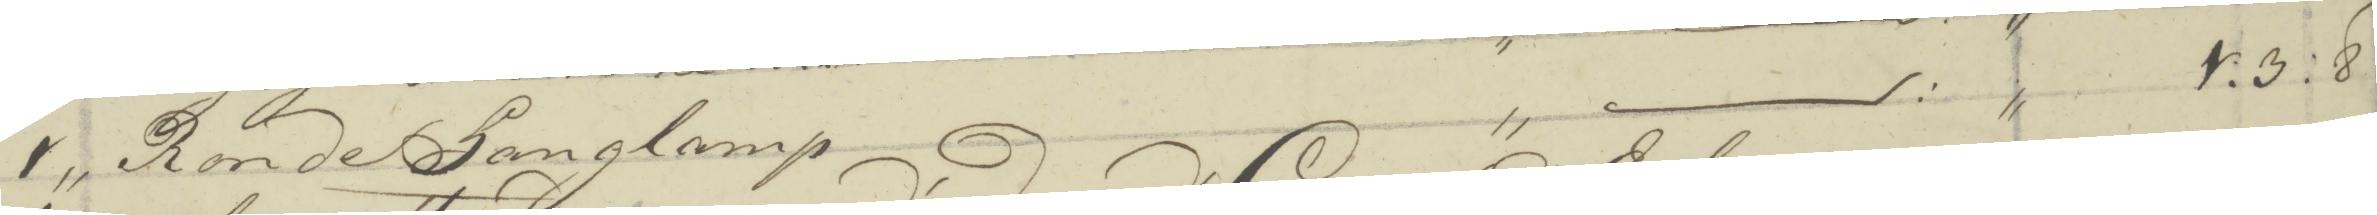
1„ Ronde Hanglamp „ —: „ 1:3:8
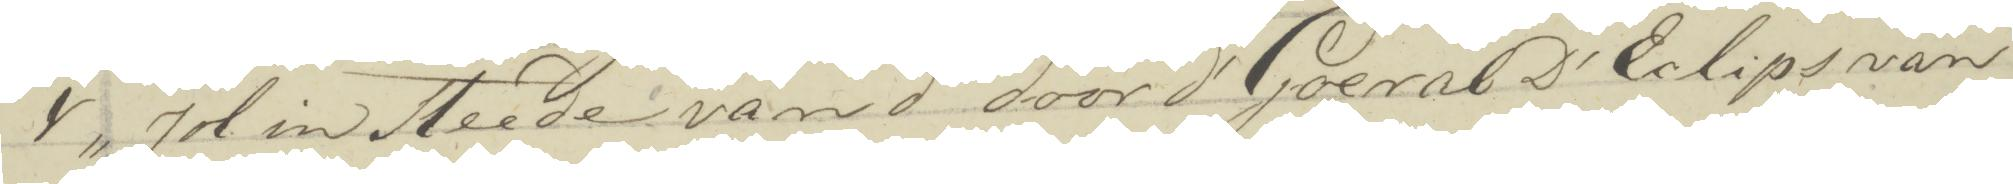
1„ Jol in Steede van d' door d’ Goerab D' Eclips van
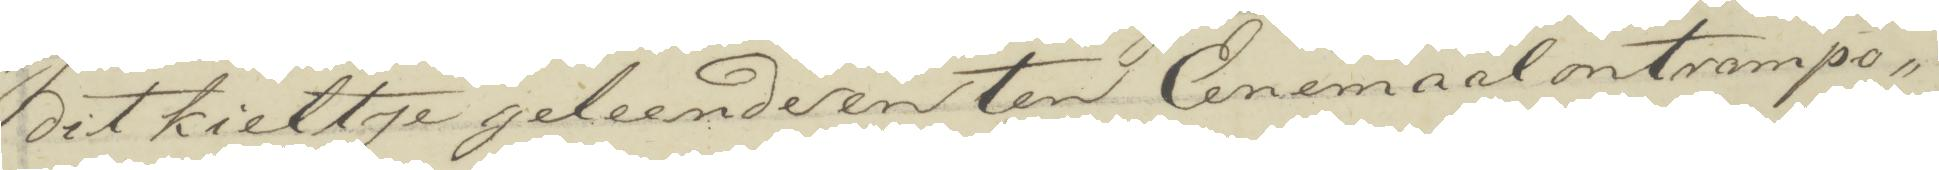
dit kieltje geleende en ten Eenemaal ontrampo„
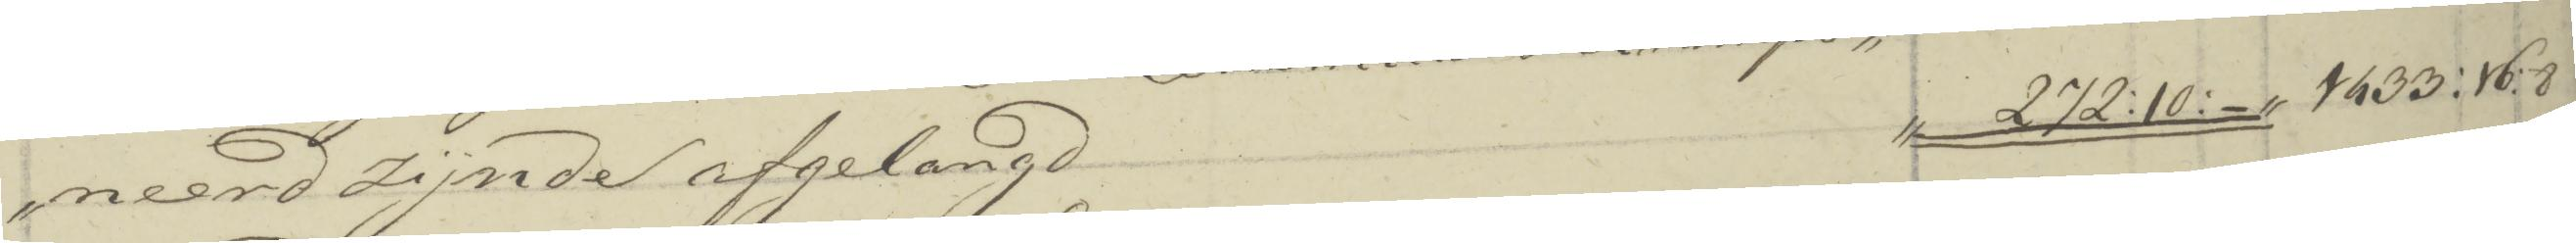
„neerd zijnde afgelangd „ 272.10:— „ 1433:16:8
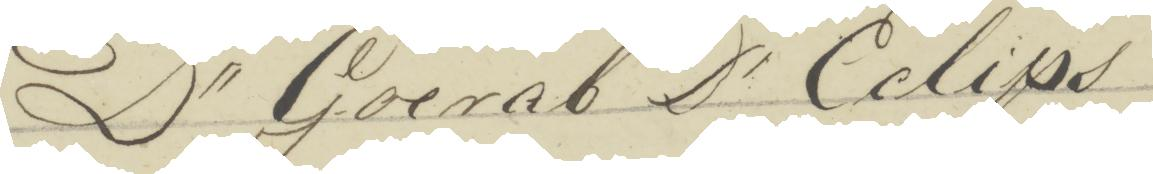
D" Goerab D' Eclips
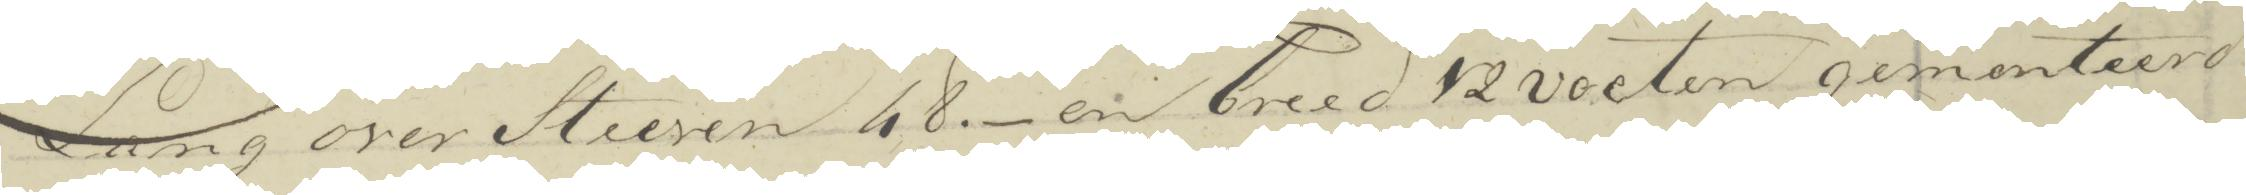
Lang over Steeven 48.— en breed 12 voeten gemonteerd
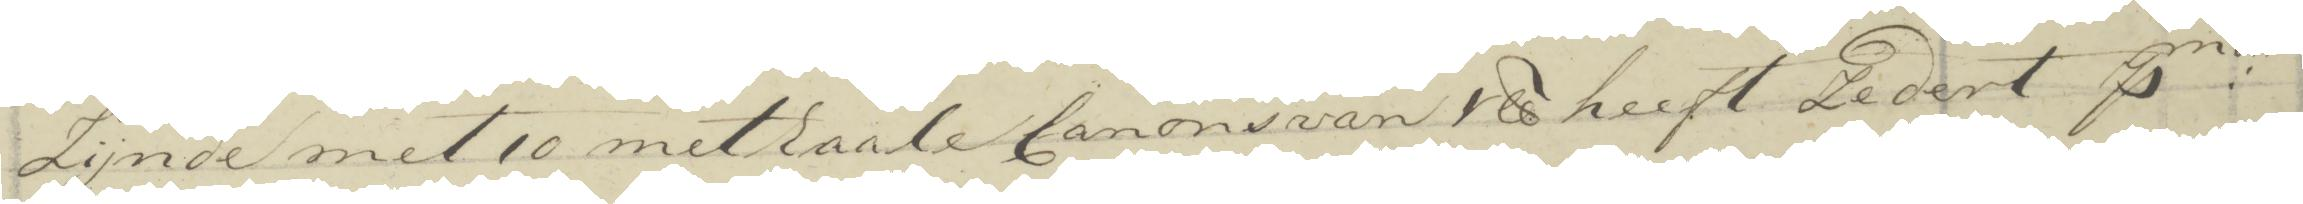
Zijnde met 10 methaale Canons van 1 lb heeft zedert p:mo"
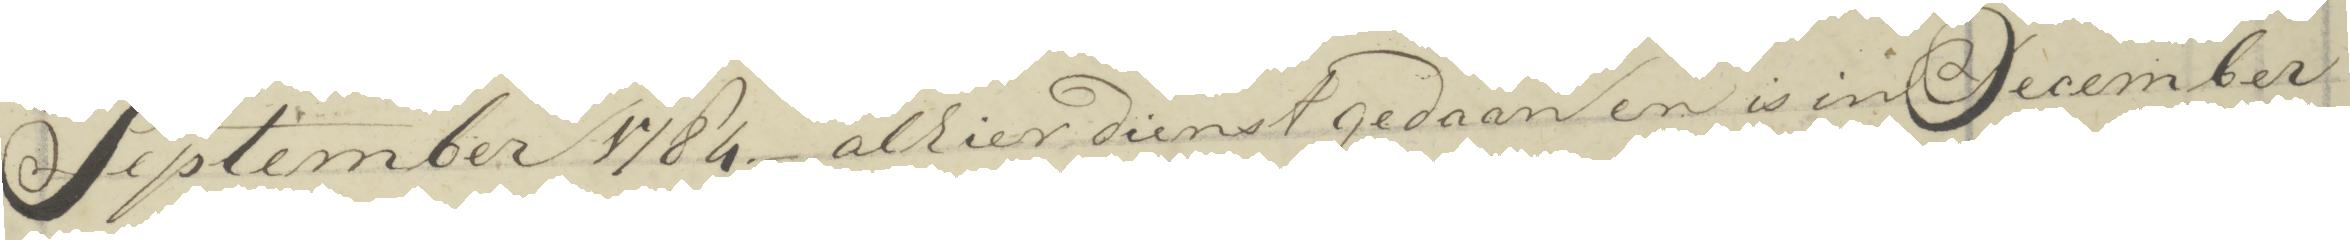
September 1784. alhier dienst gedaan en is in December
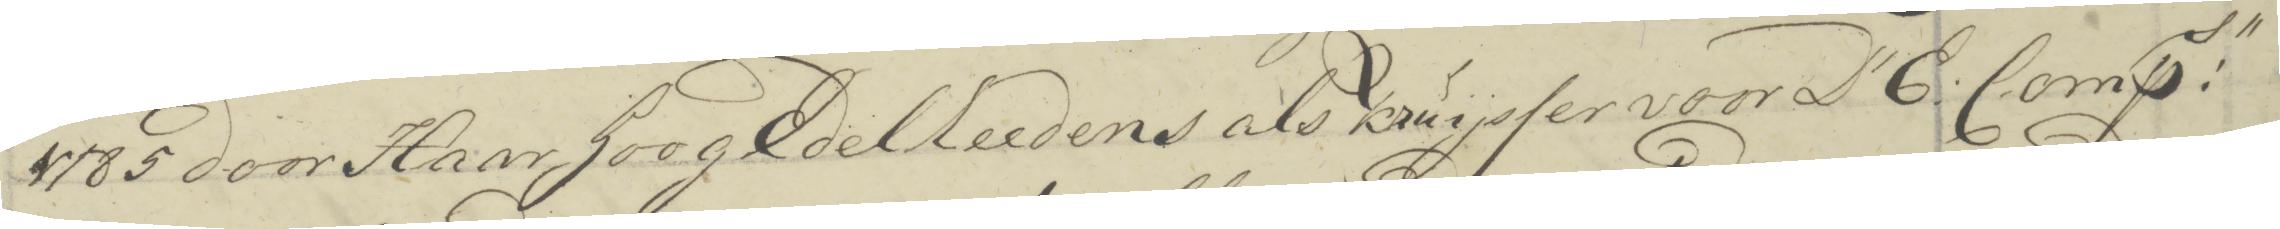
1785 door Haar Hoog Edelheedens als kruijsser voor D'E: Comp:s"
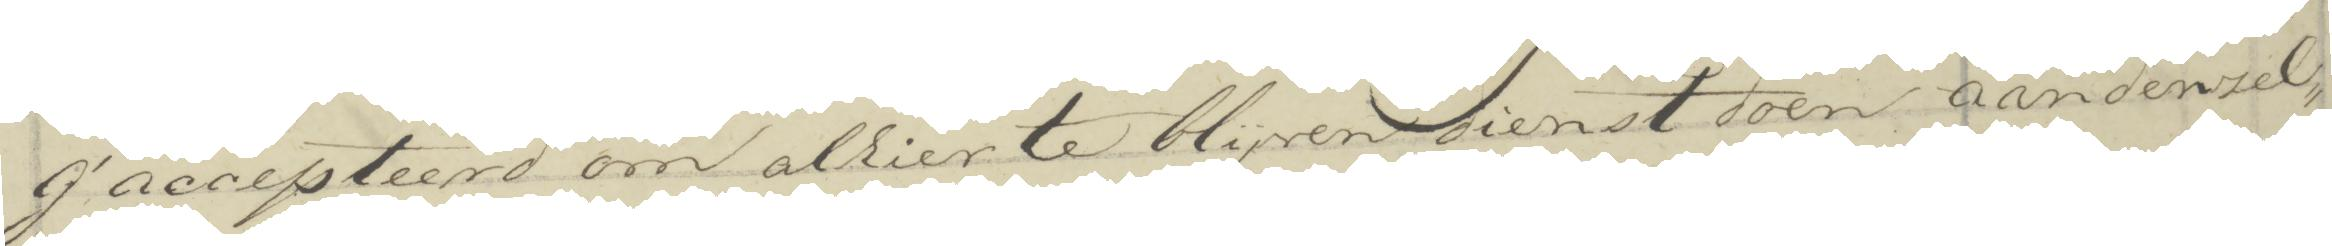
g’accepteerd om alhier te blijven dienst doen aan den zel„
